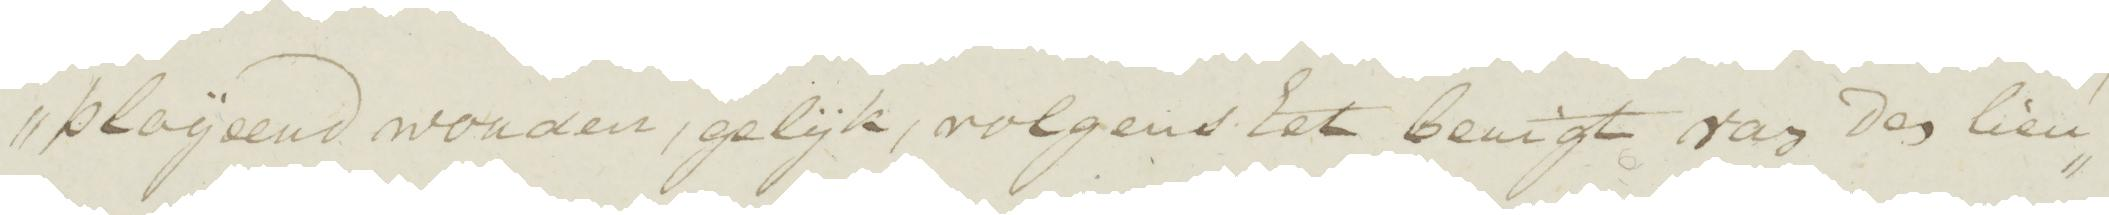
„ploijeerd worden, gelijk, volgens het berigt van den lieu„
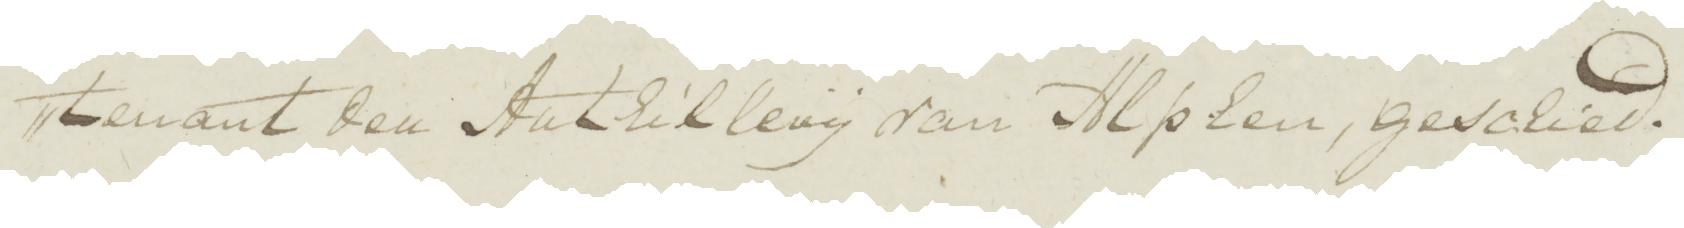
„tenant der Arthillerij van Alphen, geschied.
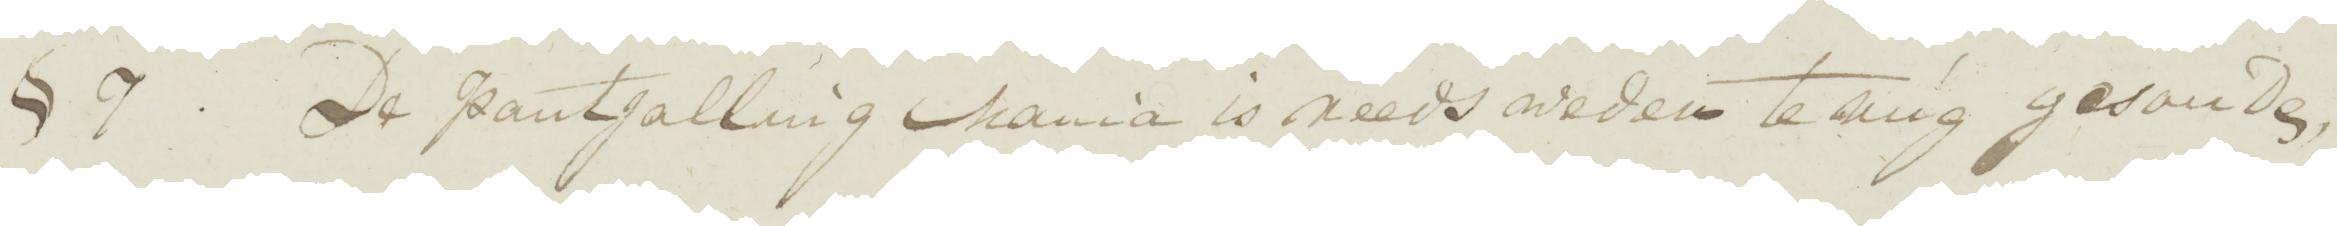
§ 7 De Pantjalling Maria is reeds weder te rug gesonden,
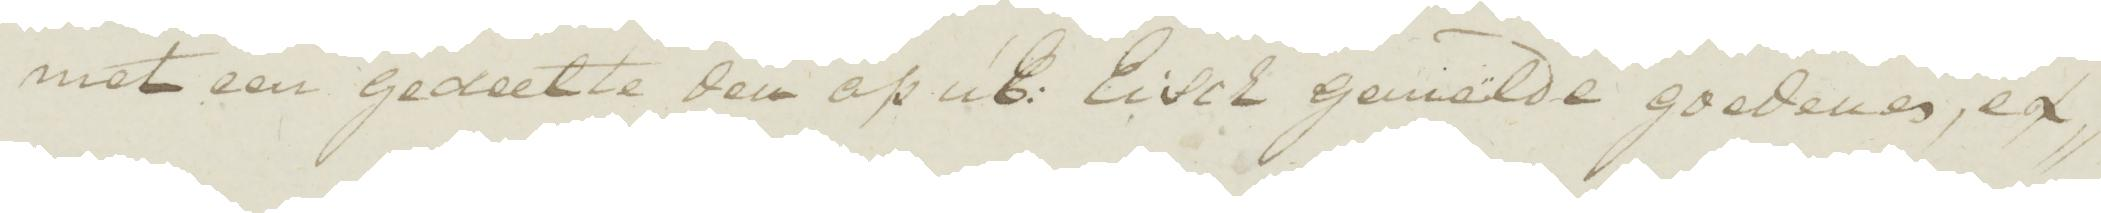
met een gedeelte der op uE: Eisch gemelde goederen, ex„
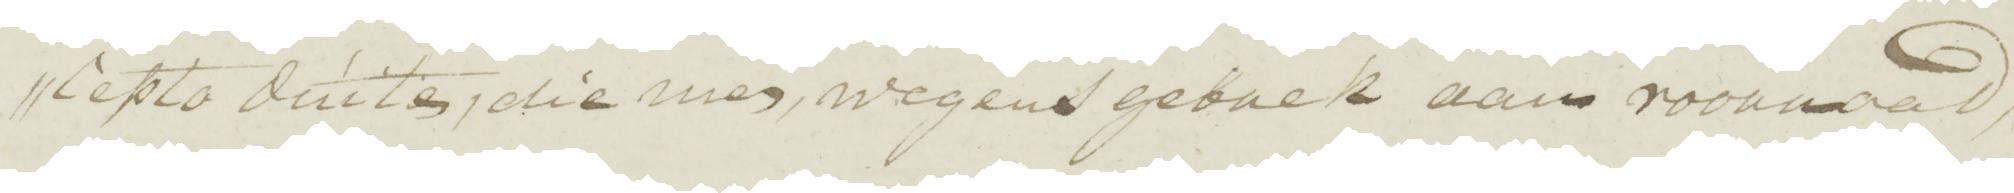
„cepto duiten, die men, wegens gebrek aan voorraad,
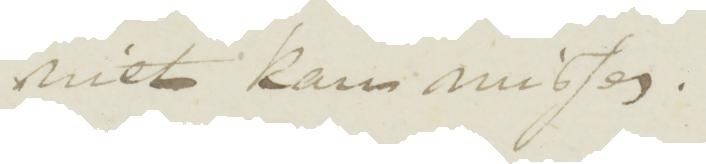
niet kan missen.
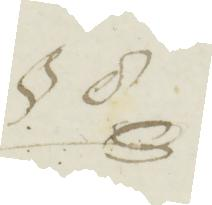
§ 8
